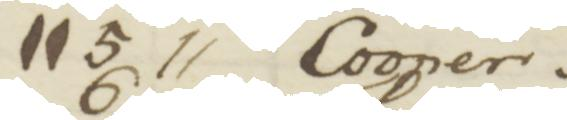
115 „ Cooper
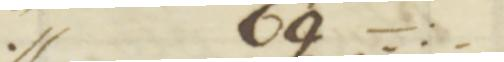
„ 69 —:—
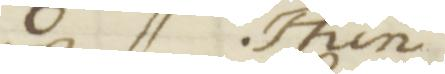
6 „ Thin
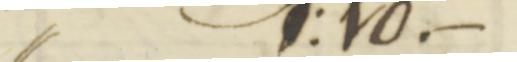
„ 1:10.—
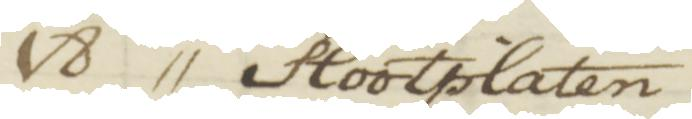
18 „ Slootplaten
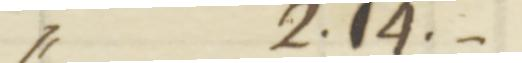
„ 2.14.—
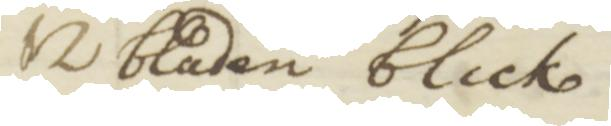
12 bladen blick
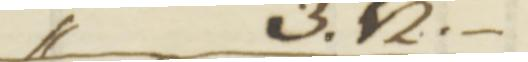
„ 3.12.—
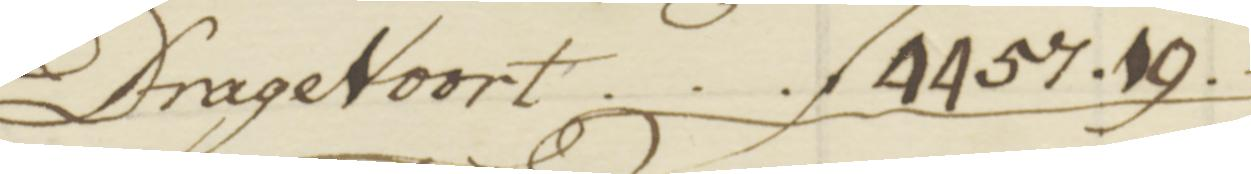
DrageVoort ƒ 4457.19.—
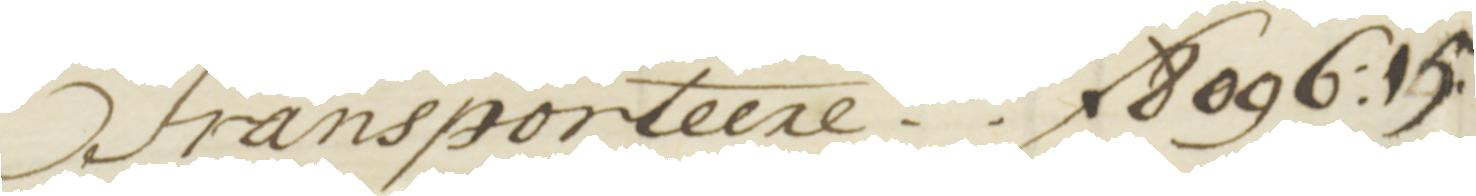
Transporteere .. ƒ8096:15.—
